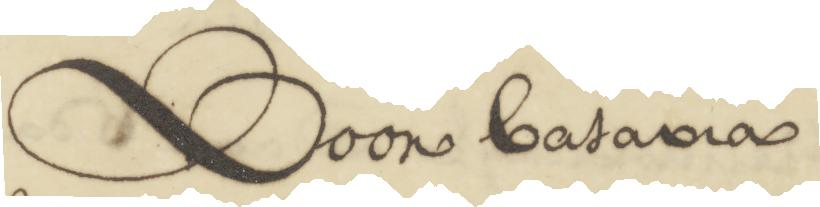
Voor batavia
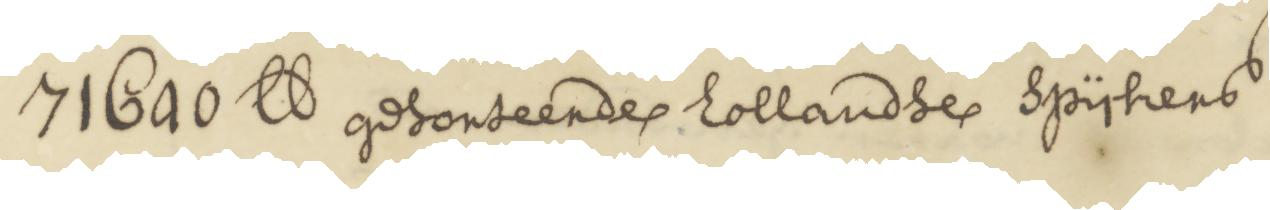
71640 lb gesorteerde hollandse spijkers
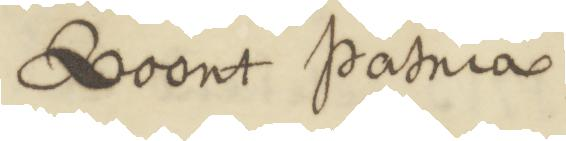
voort patria
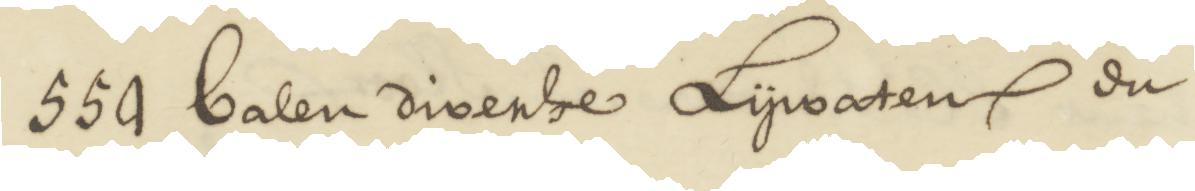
554 balen diverse Lijwaten en
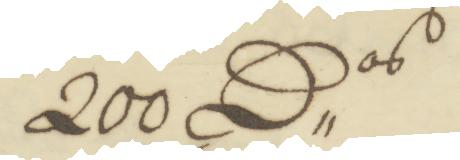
200 D„os
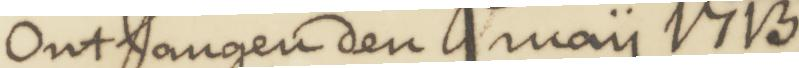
Ontfangen den 4' maij 1713
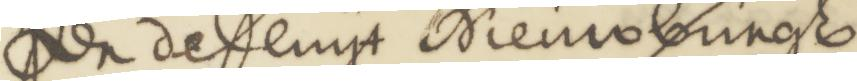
per defluijt Nieuwburg
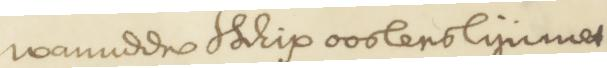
wanneer tschip oosterstijnmet
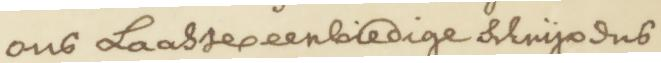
ons Laaste eerbiedige schrijvens
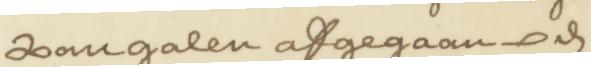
van galen afgegaan en
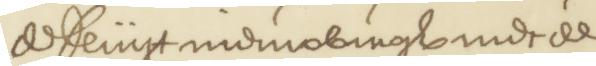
defluijt nieuwburgh met de
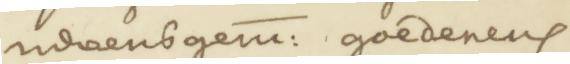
nevens gem: goederen
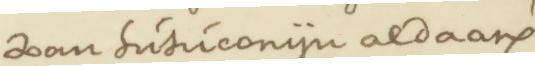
van tutucorijn aldaar
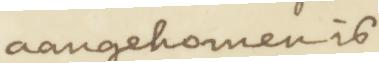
aangekomen is
